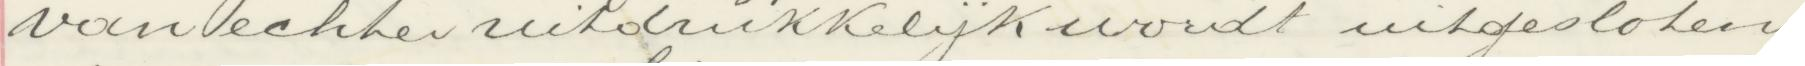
van echter uitdrukkelijk wordt uitgesloten
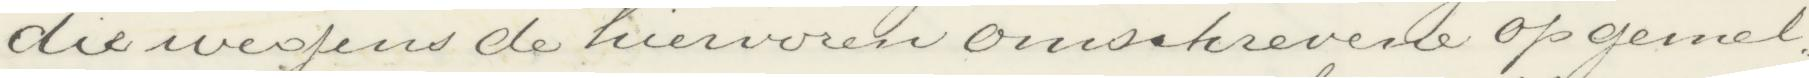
die wegens de hiervoren omschrevene opgemel
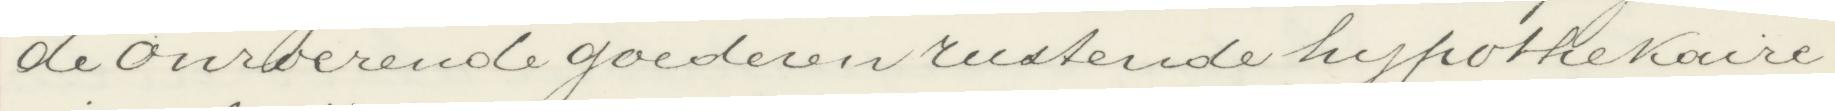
de onroerende goederen rustende hypothekaire
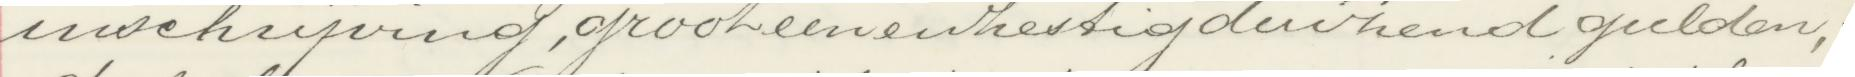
inschryving, groot een en zestig duizend gulden,
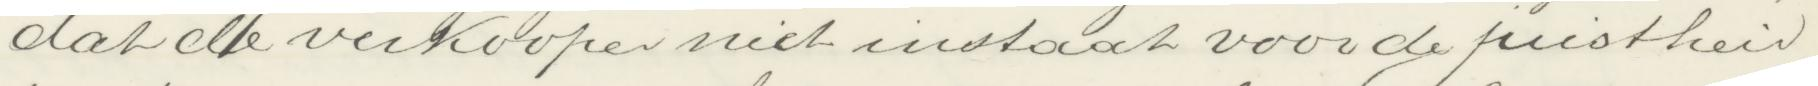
dat de verkooper niet instaat voor de juistheid
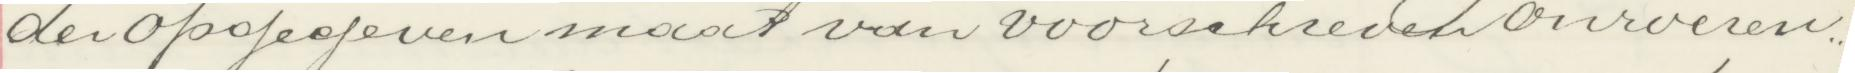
der opgegeven maat van voorschreven onroeren„
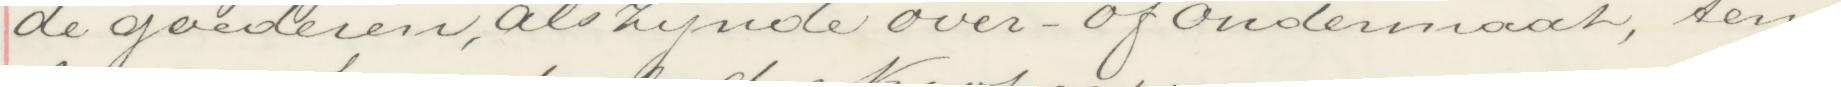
de goederen, als zijnde over - of ondermaat, ten
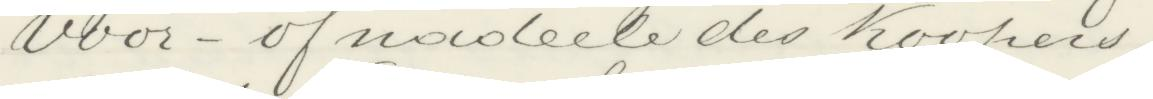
voor - of nadeele des koopers
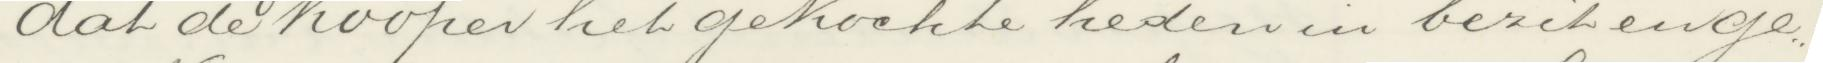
dat de kooper het gekochte heden in bezit en ge„
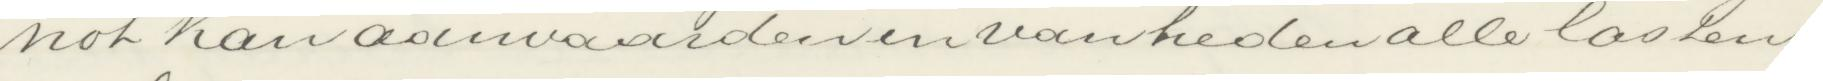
not kan aanvaarden en van heden alle lasten
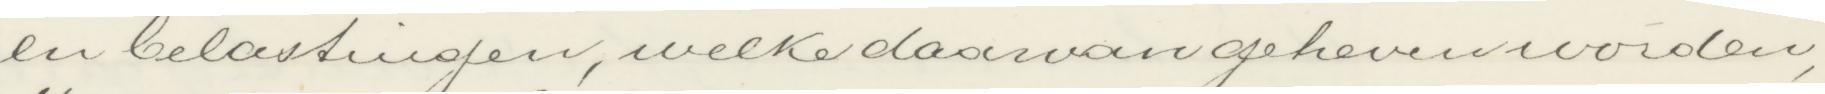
en belastingen, welke daarvan geheven worden,
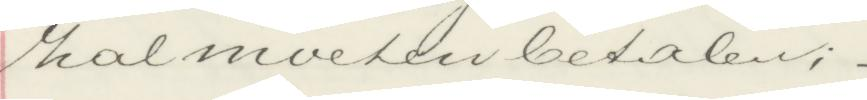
zal moeten betalen;
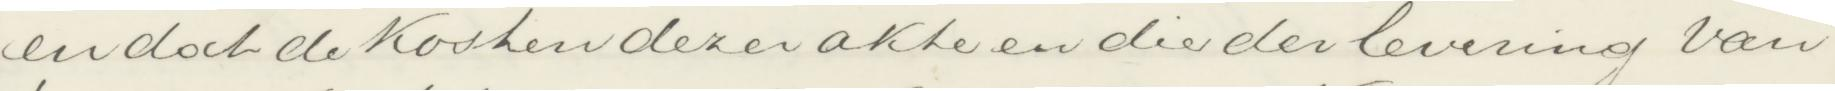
en dat de kosten dezer akte en die der levering van
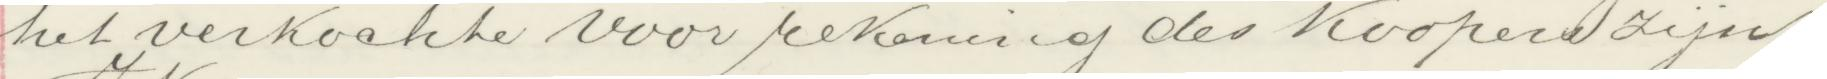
het verkochte voor rekening des koopers zijn.
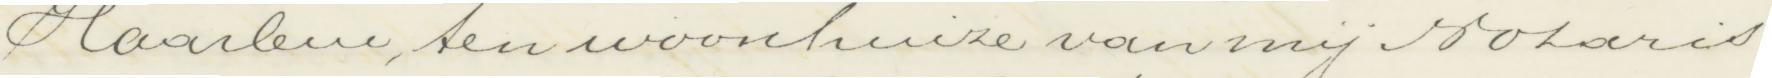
Haarlem, ten woonhuize van mij Notaris
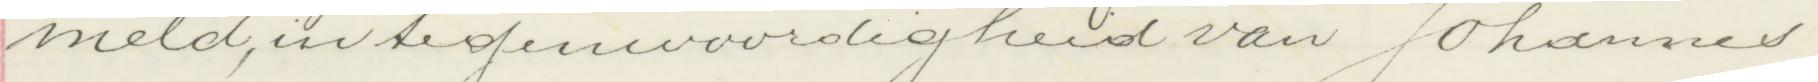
meld, in tegenwoordigheid van Johannes
